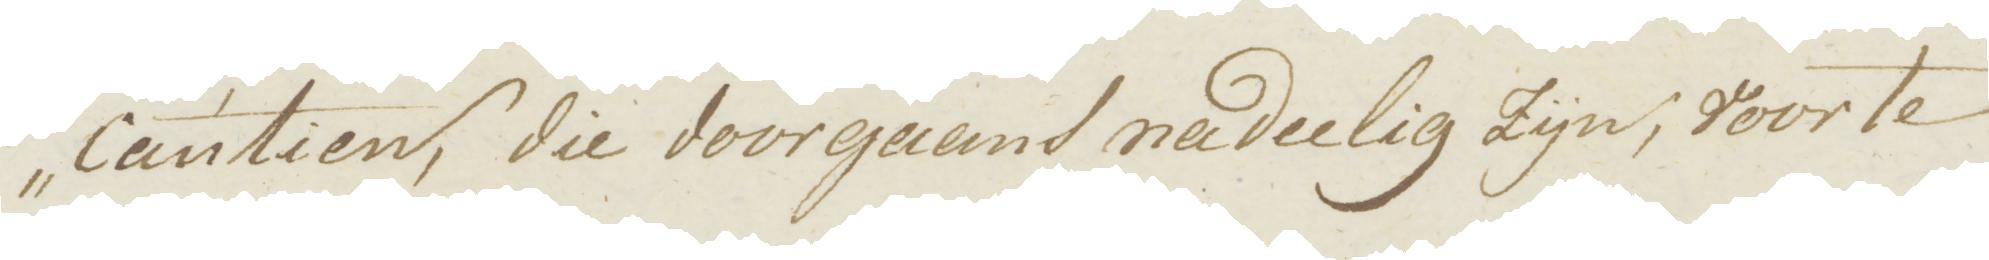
„cautien, die doorgaans nadeelig zijn, voor te
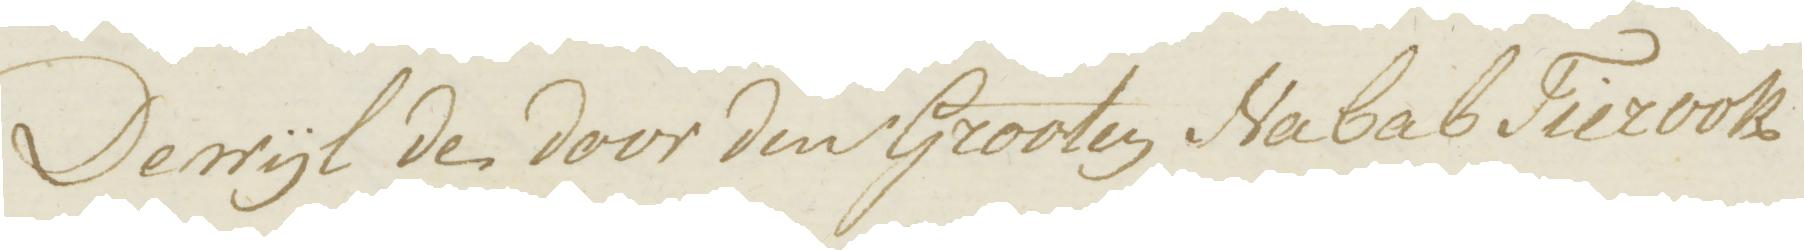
Dewijl de door den Grooten Nabab Tierook
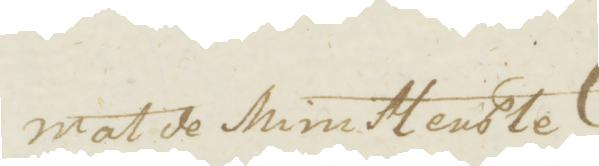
wat de Ministers te
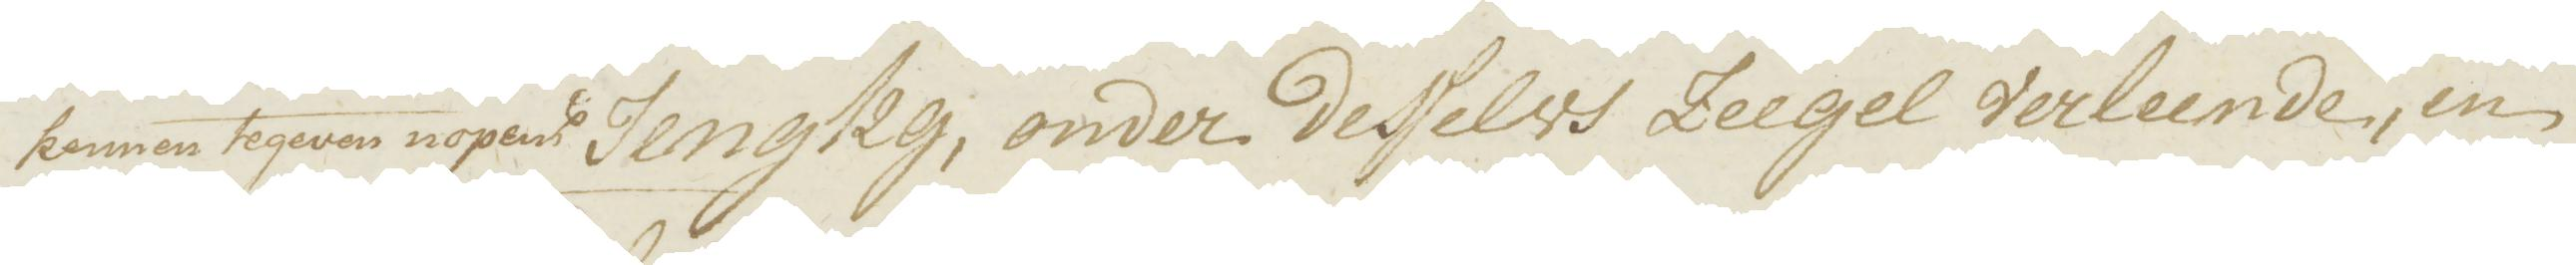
kennen tegeven nopens Tengkg, onder desselvs zeegel verleende, en
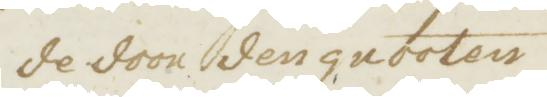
de door den grooten
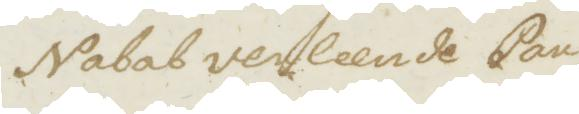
Nabab verleende Par
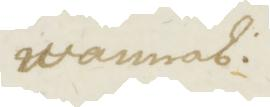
wannah:
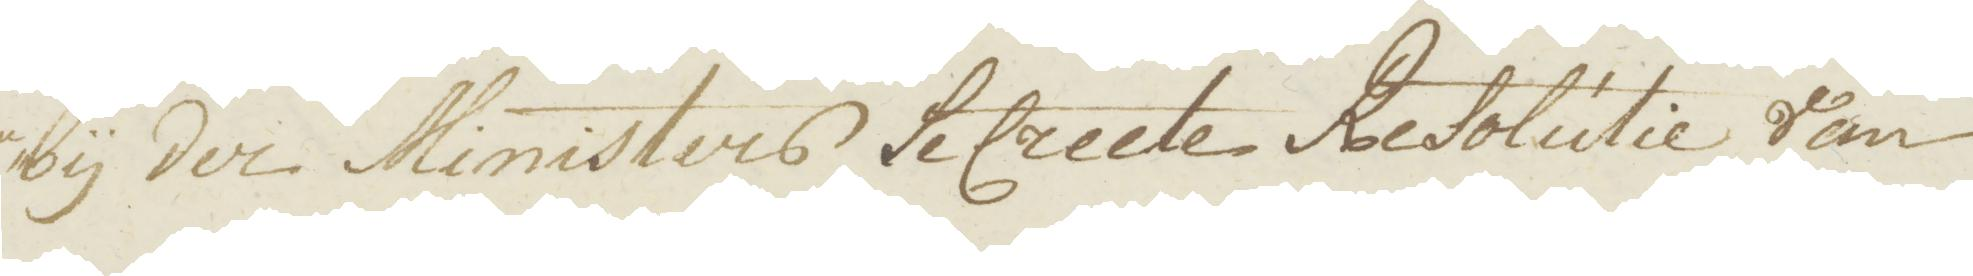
bij der Ministers secreete Resolutie van
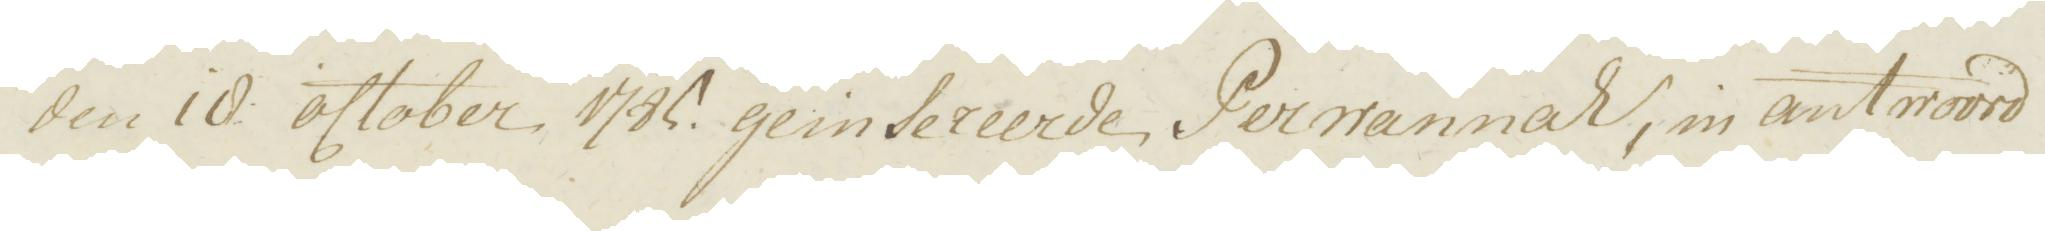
den 18: october 1785. geinsereerde Perwannah, in antwoord
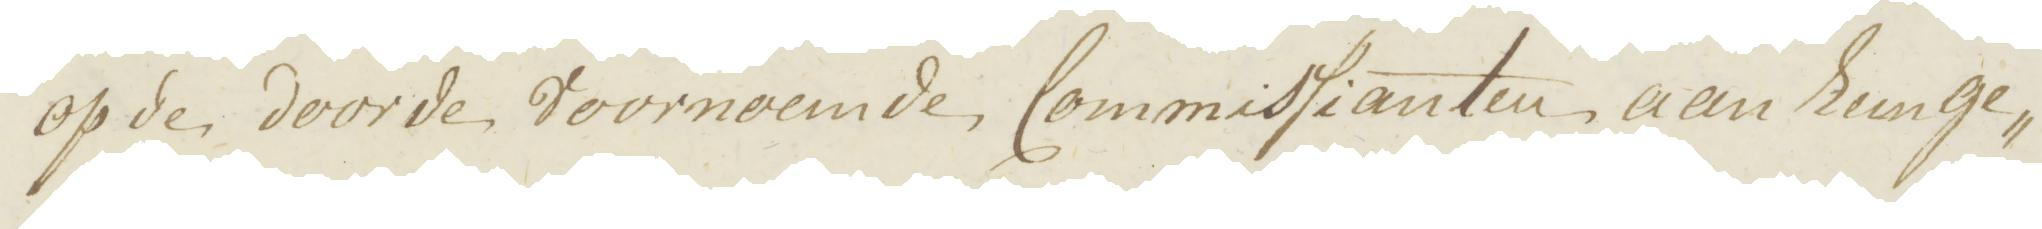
op de door de voornoemde commissianten aan hun ge„
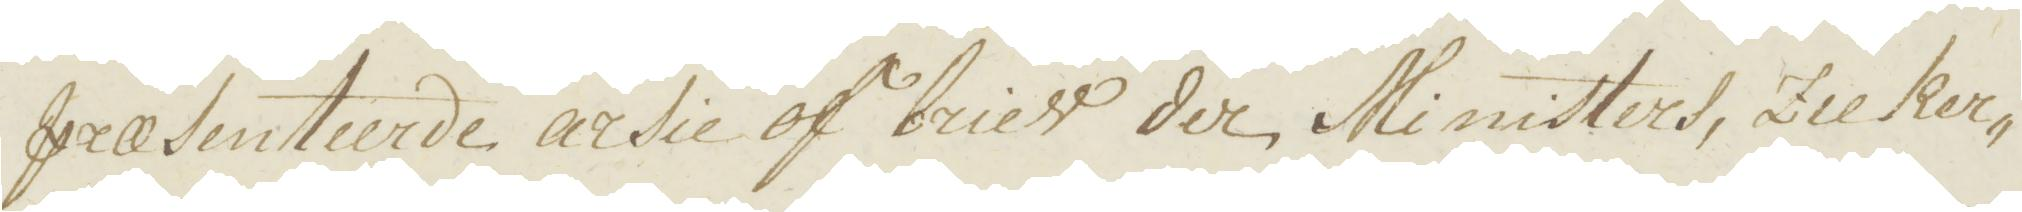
preesenteerde arsie of briev der Ministers, zieker„
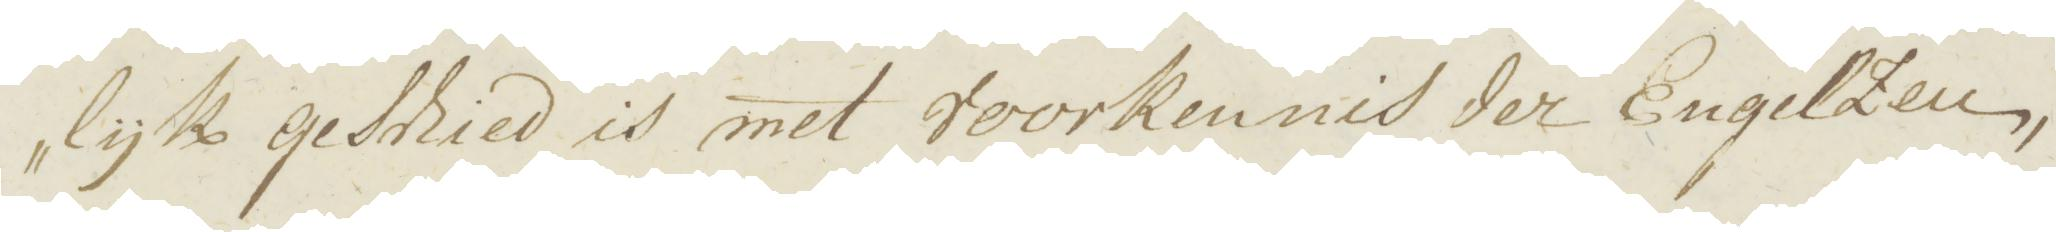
„lijk geschied is met voorkennis der Engelzen,
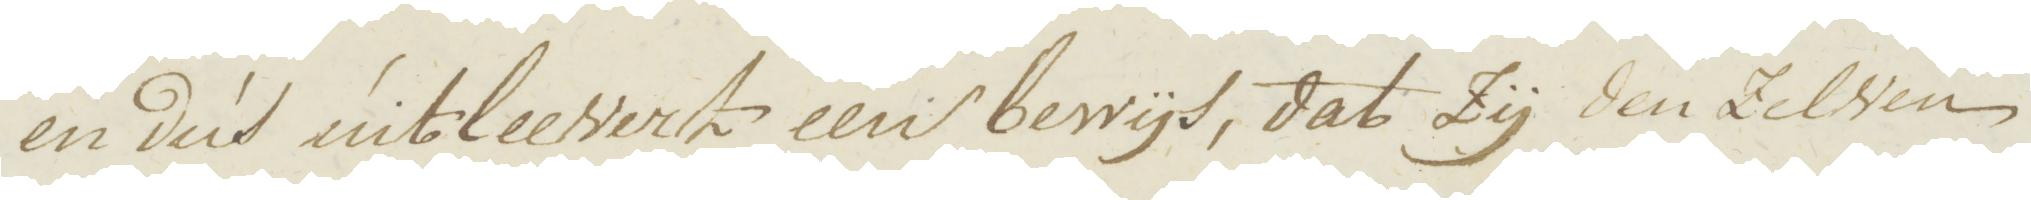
en dus uitleevert een bewijs, dat zij denzelven
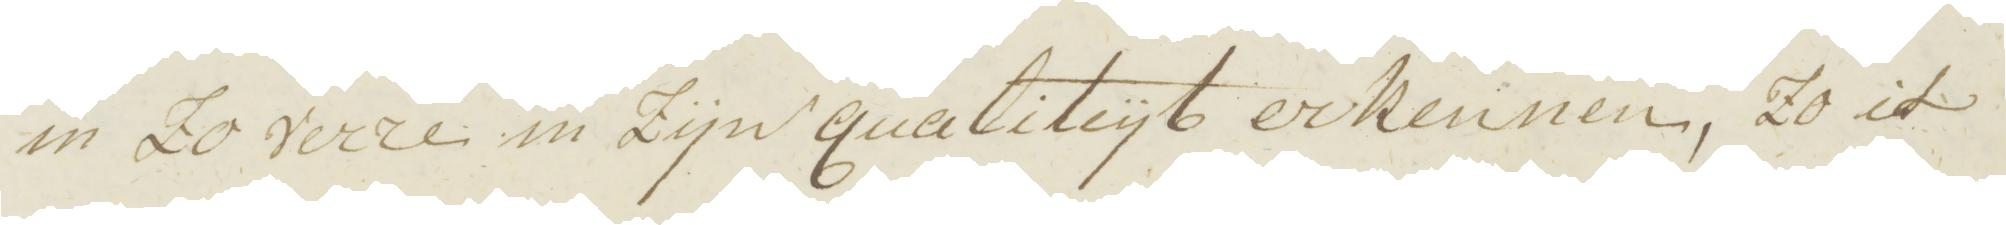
in zo verre in zijn qualiteijt erkennen, zo is
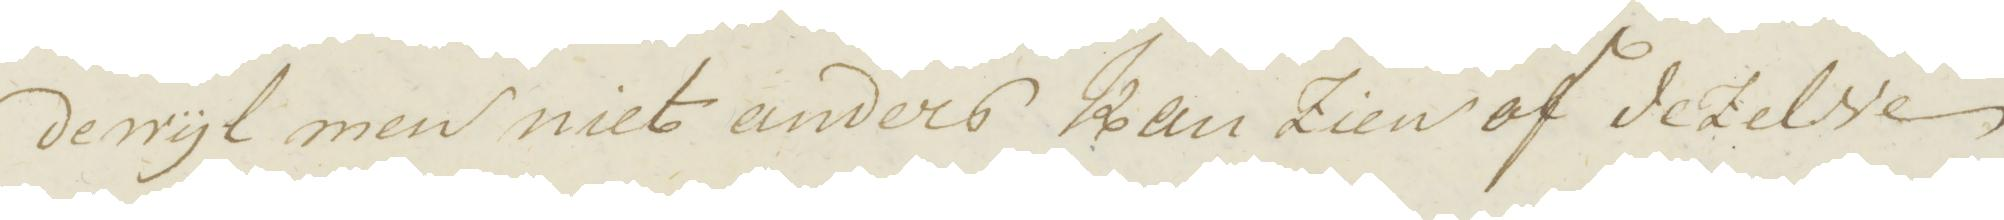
dewijl men niet anders kan zien of dezelve
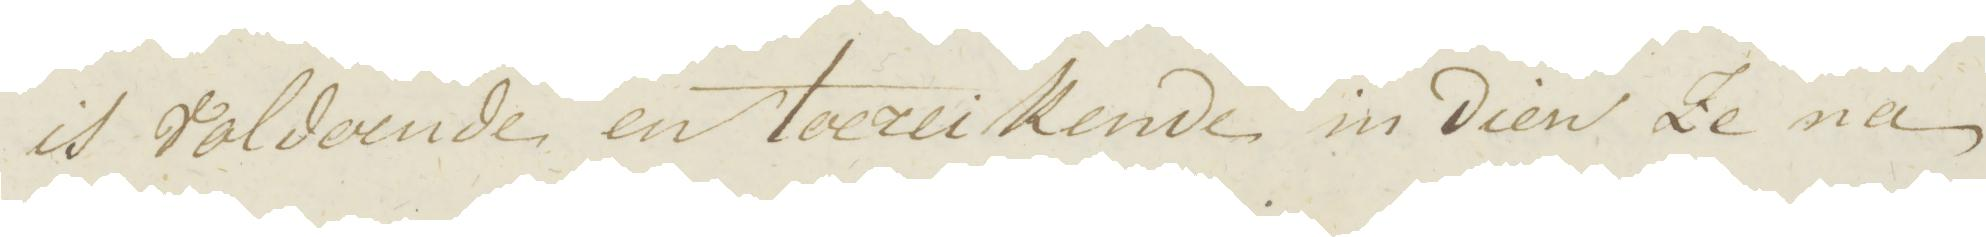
is voldoende en toereikende in dien ze na
